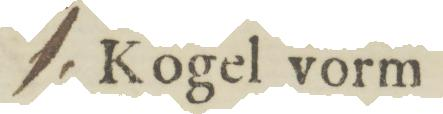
1. Kogel vorm
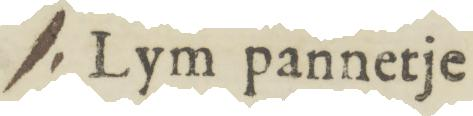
1. Lym pannetje
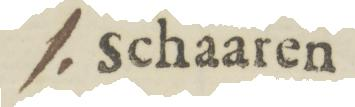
1. Schaaren
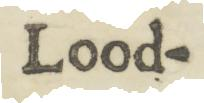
Lood-
